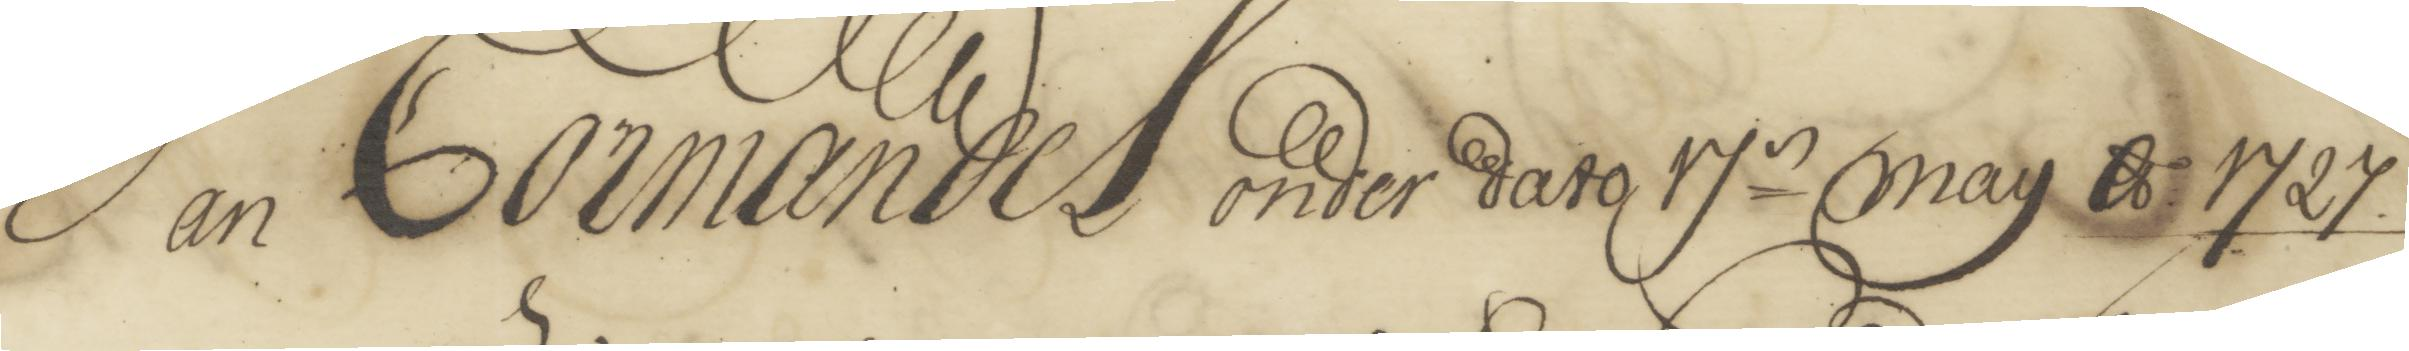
Van Cormandel onder dato 17:e may A:o 1727.
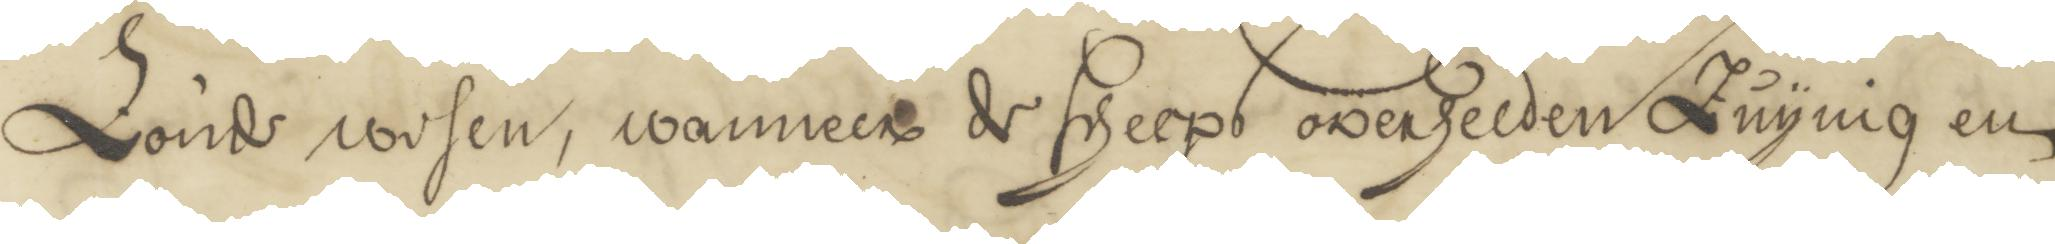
zoude wesen, wanneer de scheeps overheeden Zuijnig en
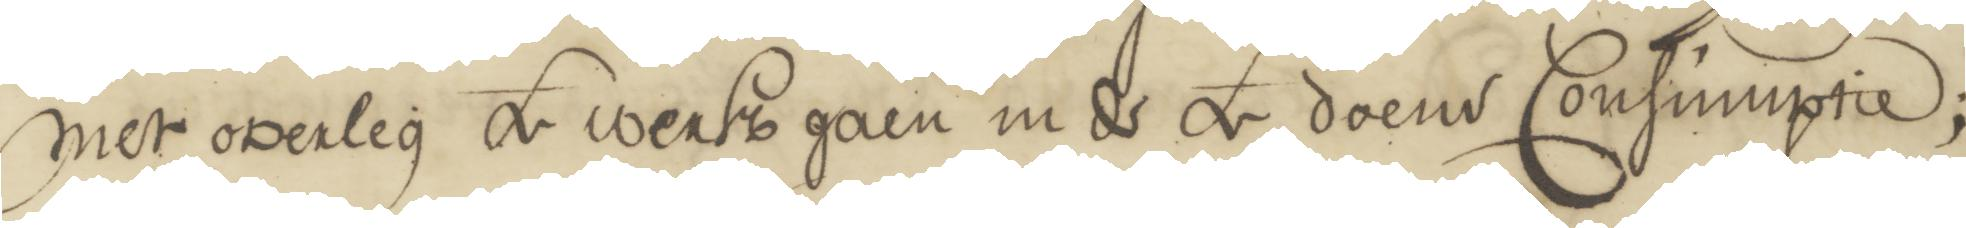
met overleg te werk gaen in de te doene Consumptie;
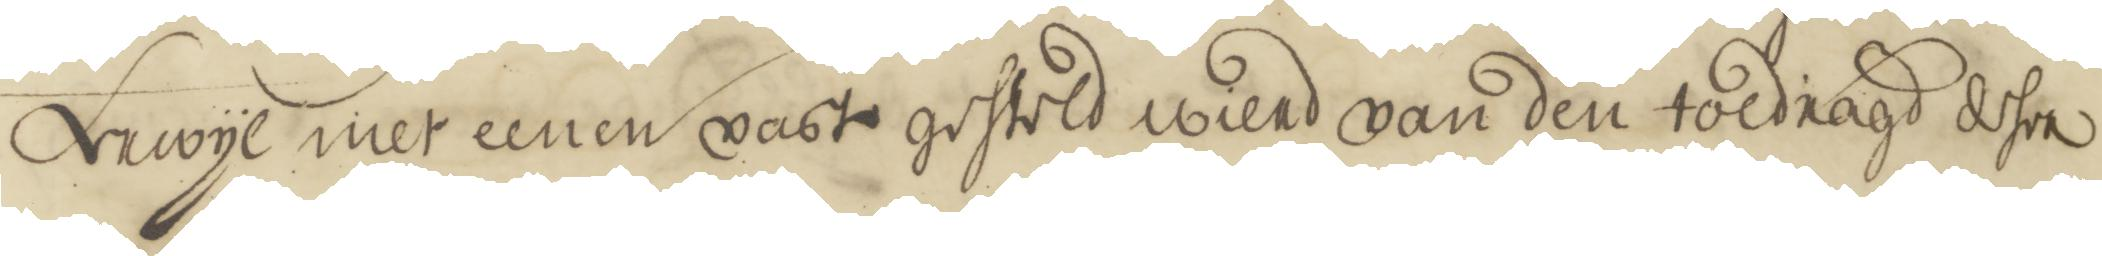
terwijl met eenen vast gesteld wierd van den toedragd deser
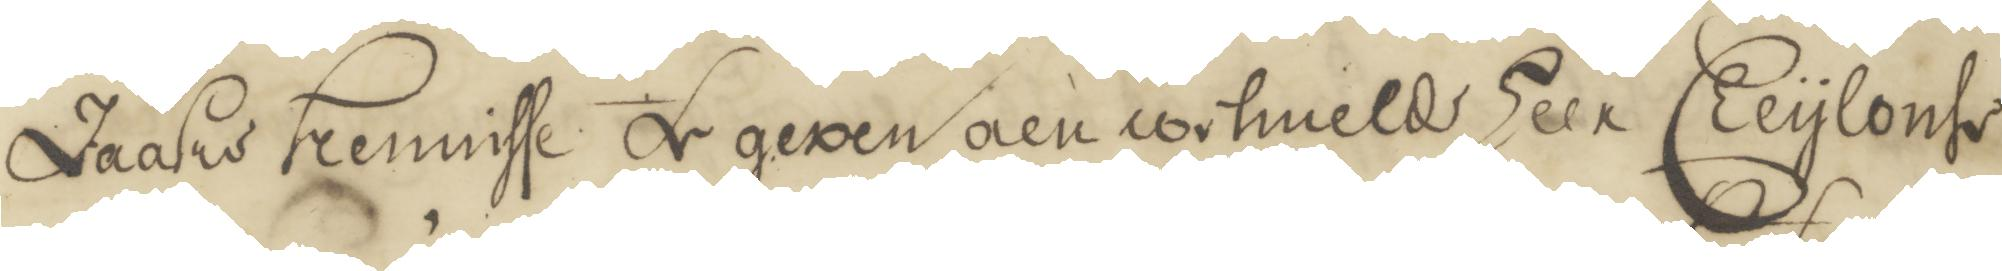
Zaake kennisse te geven aen welmelde heer Cheijlonse
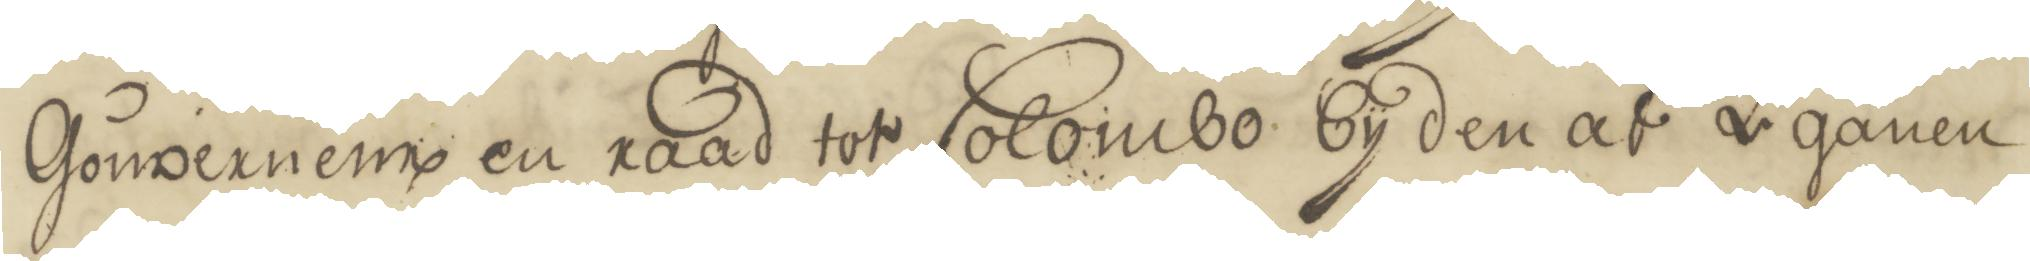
Gouverneur en raad tot Colombo bij den af te ganen
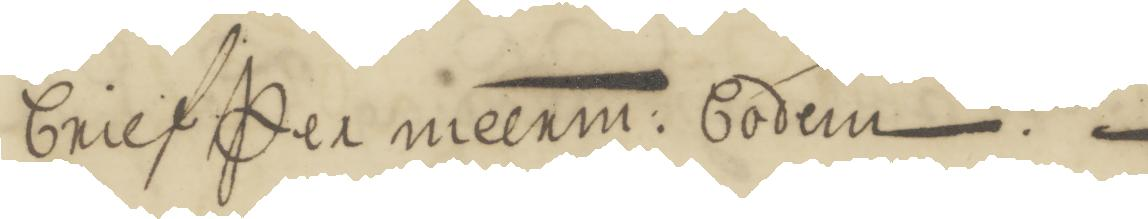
brief per meerm: bodem.
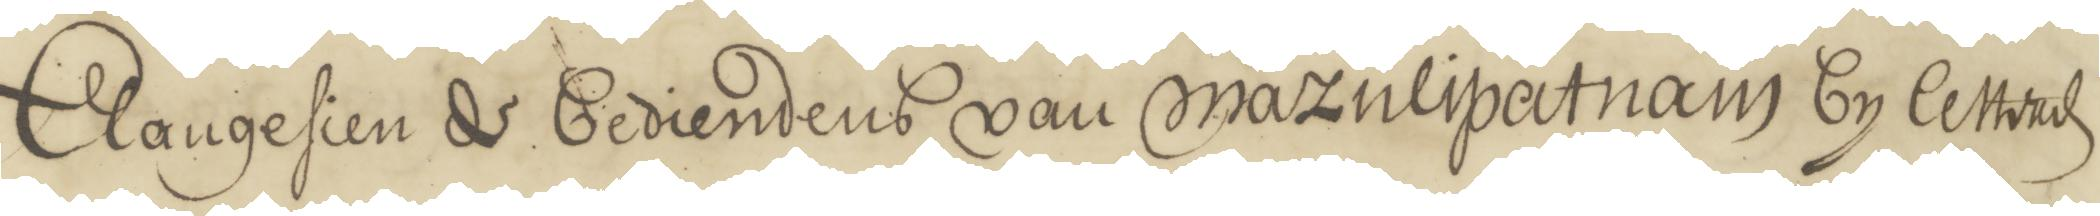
Aangesien de bediendens van mazulipatnam by letteren
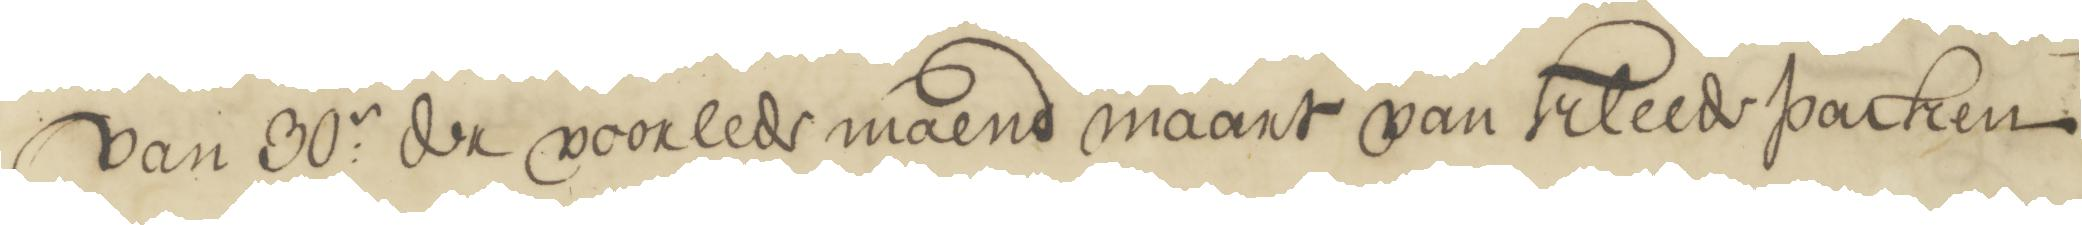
van 30:e der voorlede maend maart van kleede packen
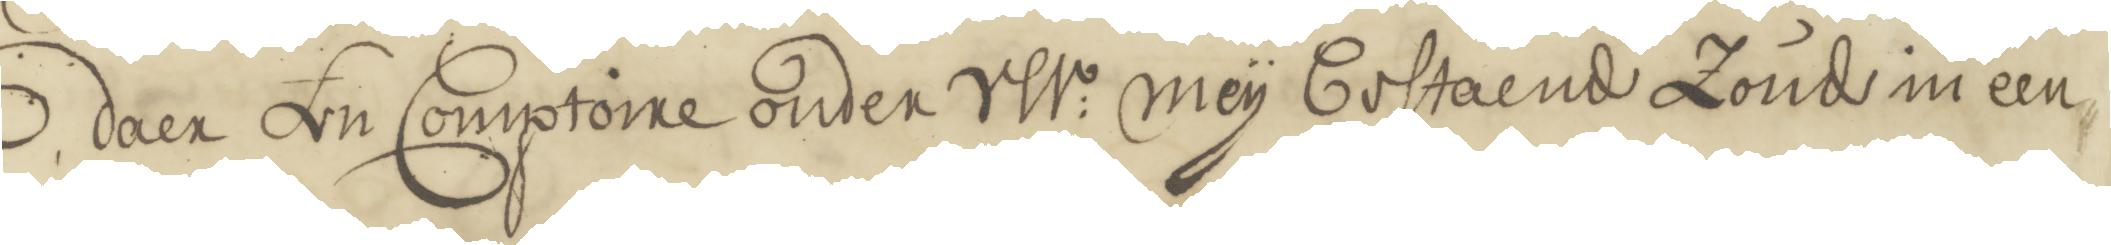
daer ten Comptoire onder Vlt:o meij bestaende Zoude in een
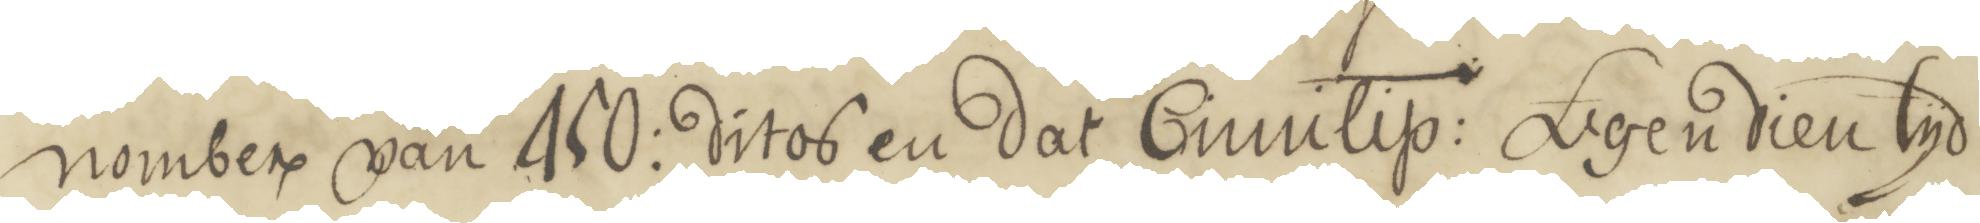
nomber van 450: ditos en dat bimilip: tegen dien tijd
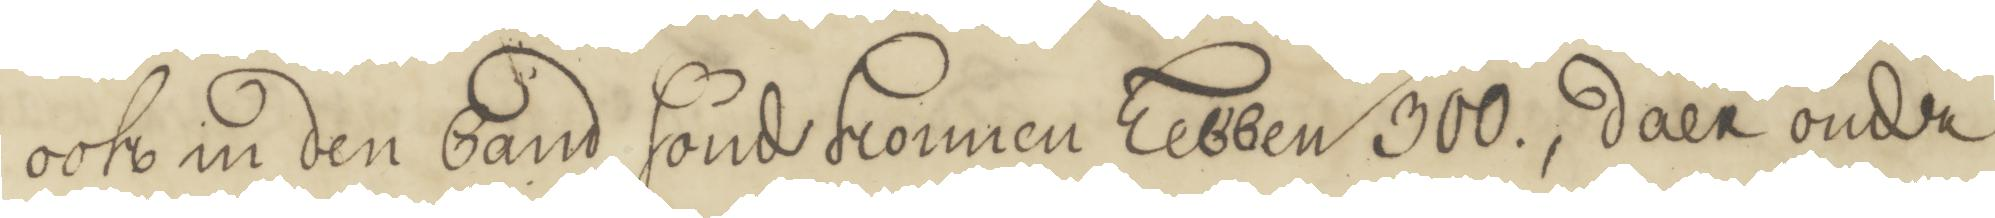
ook in den band soude konnen hebben 300., daer onder
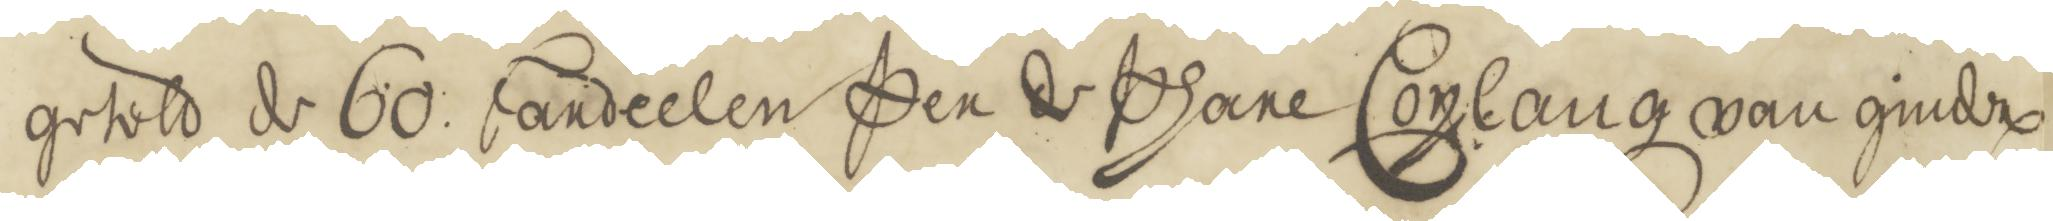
geteld de 60. fardeelen per de Phare Coylang van ginder
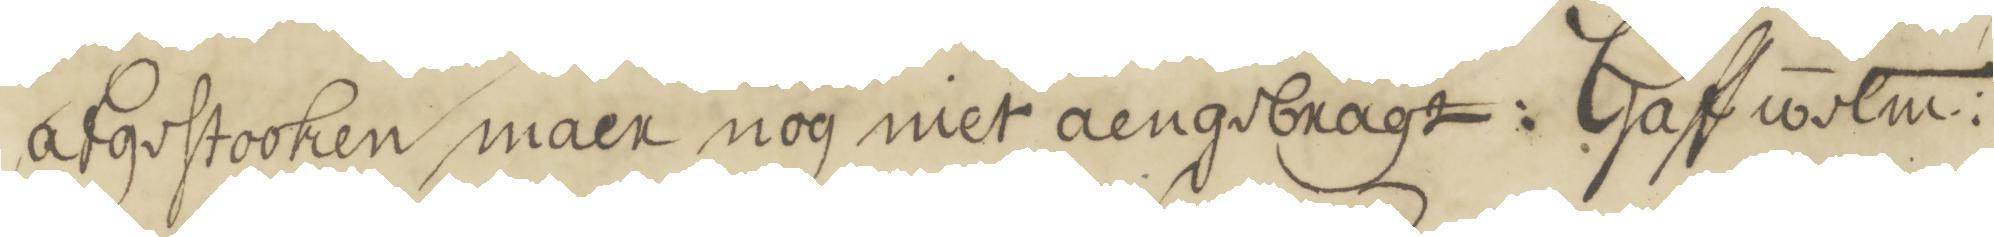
afgestooken maer nog niet aengebragt: Gaff welm:
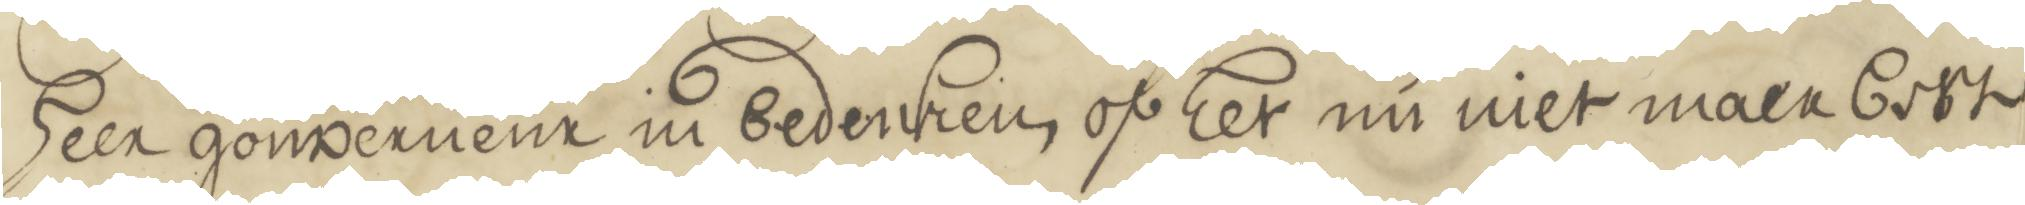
heer gouverneur in bedenken of het nu niet maer best
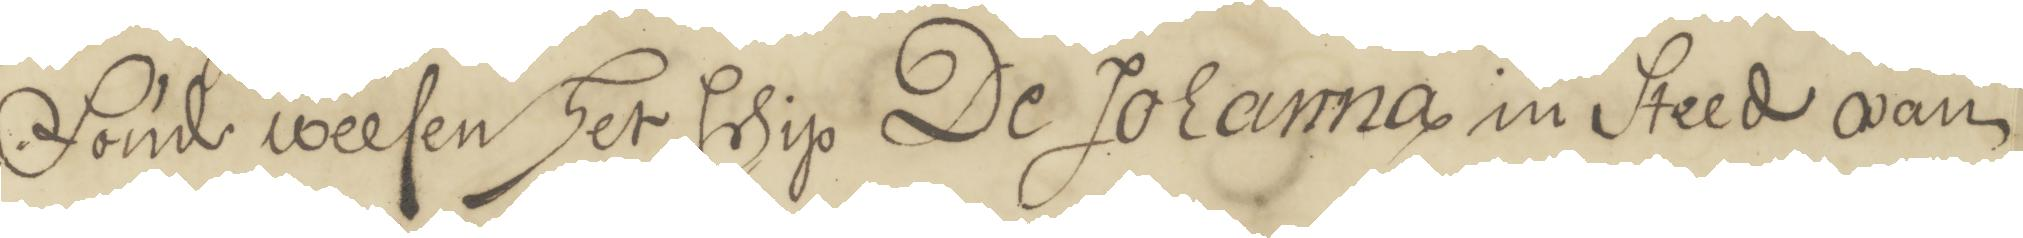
Soude weesen het schip De Johanna in Steede van
